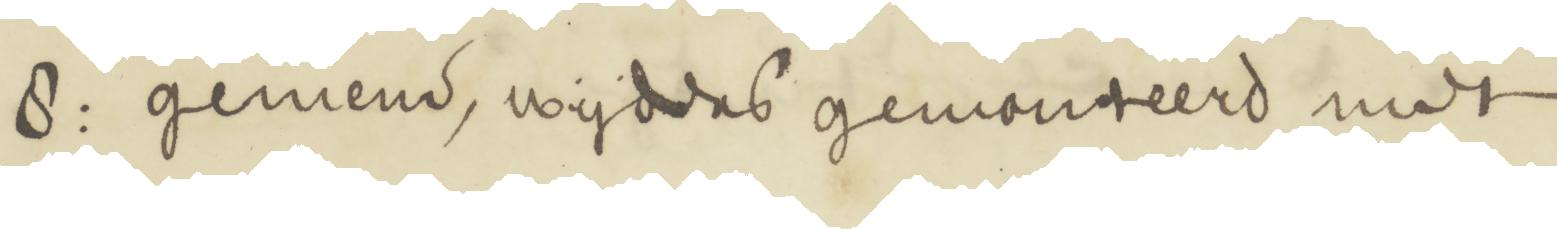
6: gemene, wijders gemonteerd met
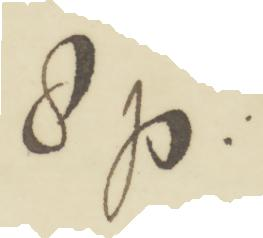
8p:s
